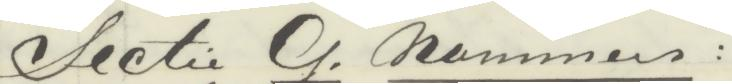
Sectie G. Nommers :
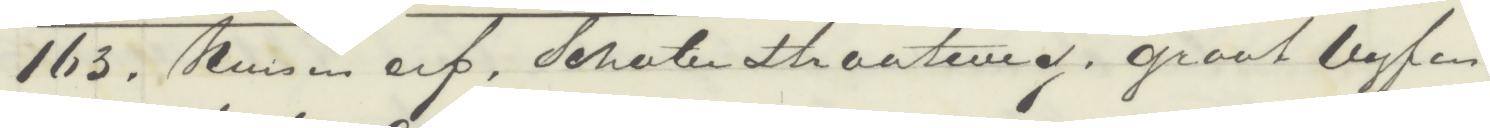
163, huis en erf, Schoterstraatweg, groot vyf en
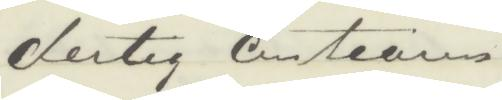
dertig centiaren
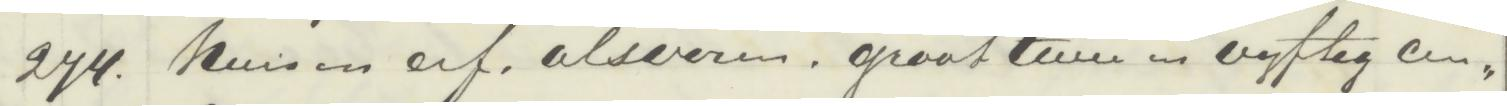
274. huis en erf, alsvoren, groot twee en vyftig cen„
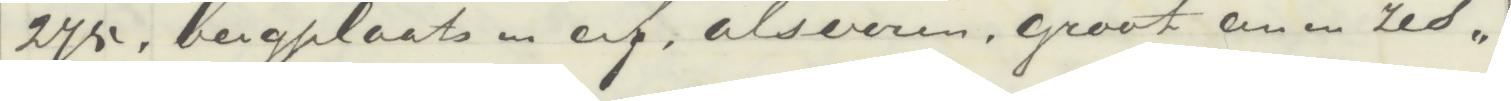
275, bergplaats en erf, alsvoren, groot een en zes„
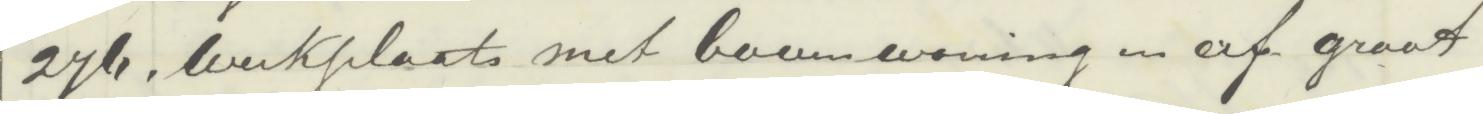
276, werkplaats met bovenwoning en erf groot
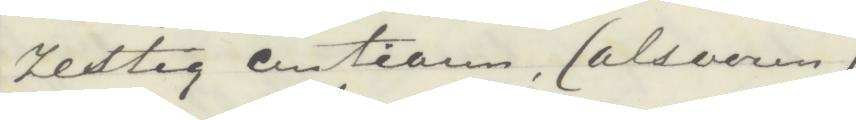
zestig centiaren, (alsvoren)
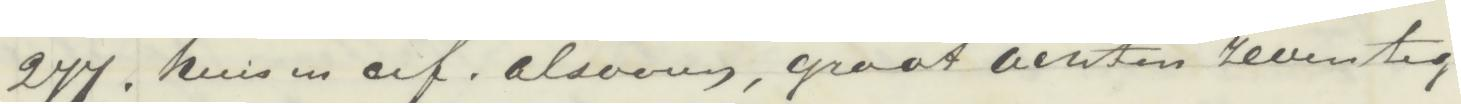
277, huis en erf. alsvoren, groot achten zeventig
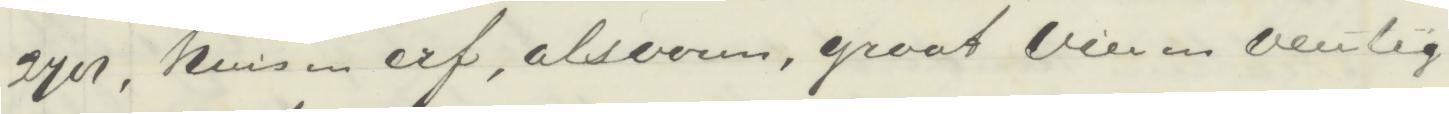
278, huis en erf, alsvoren, groot vier en veertig
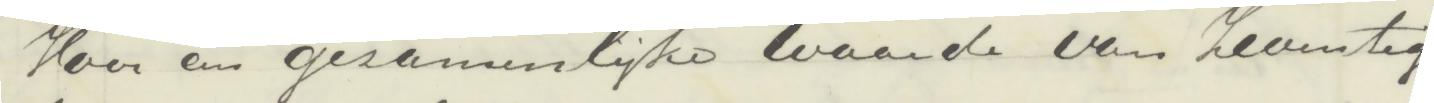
Voor een gezamenlijke waarde van Zeventig
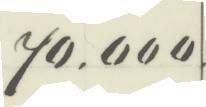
70.000
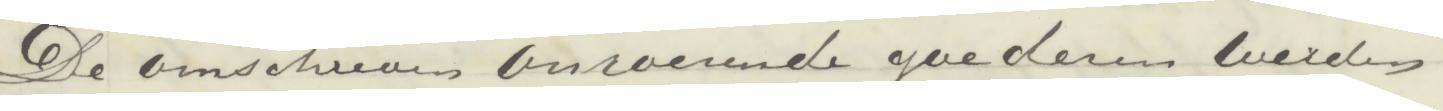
De omschreven Onroerende goederen werden
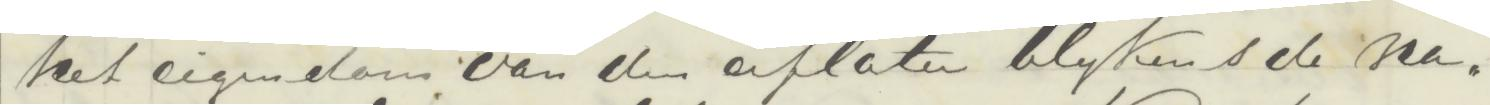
het eigendom van den erflater blykens de na„
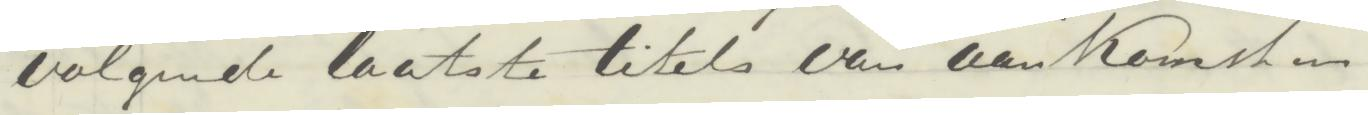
volgende laatste titels van aankomst in
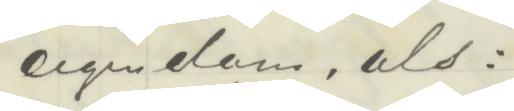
eigendom, als:
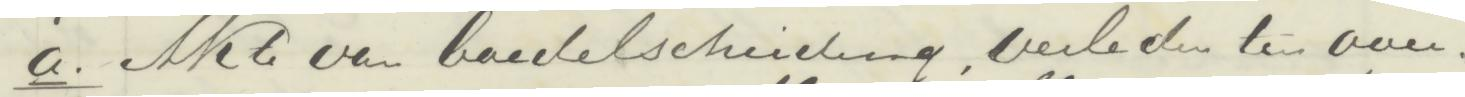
a. Akte van boedelscheiding, verleden ten over
